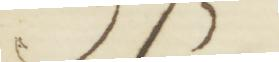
575
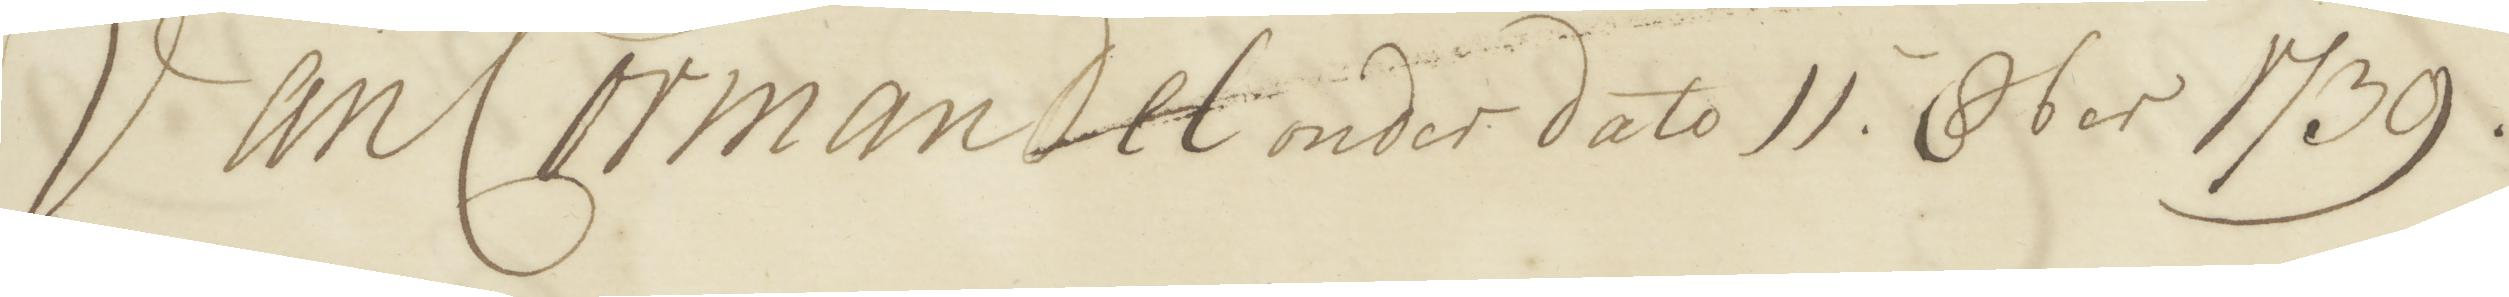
Van Cormandel onder dato 11.' 8ber 1739.
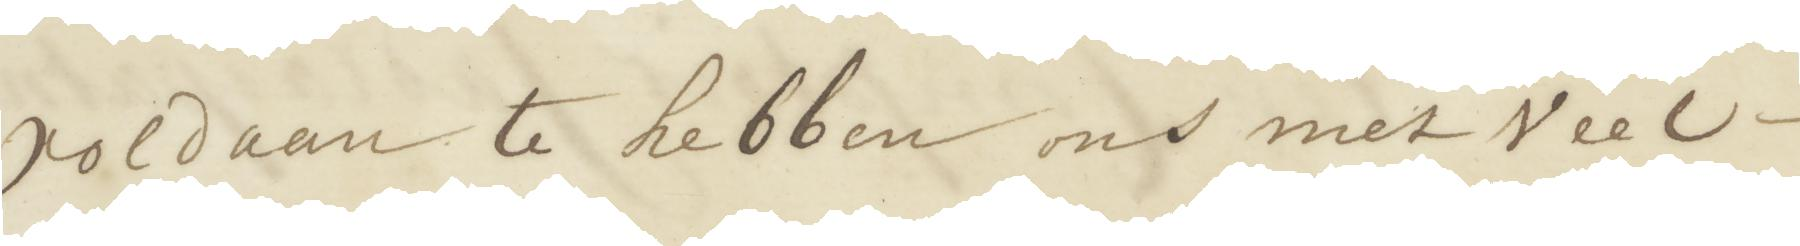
voldaan te hebben ons met veel —
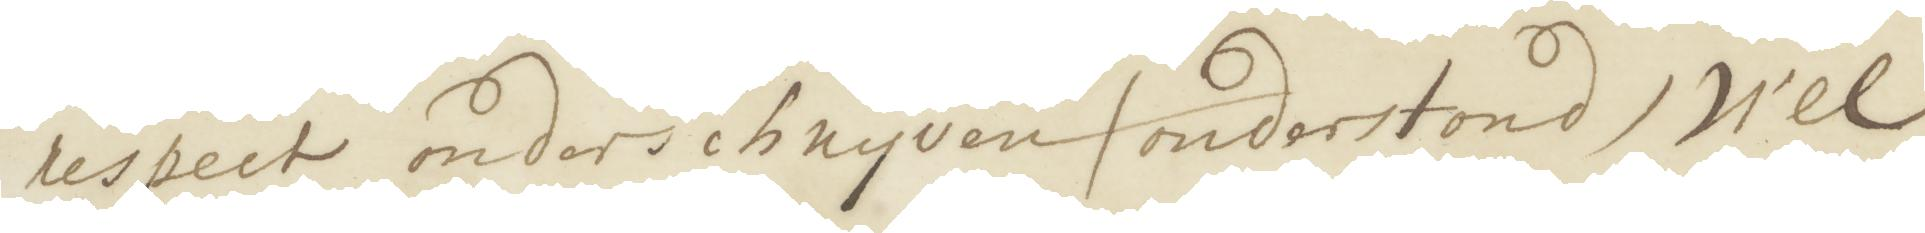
respect onderschrijven /onderstond /, wel
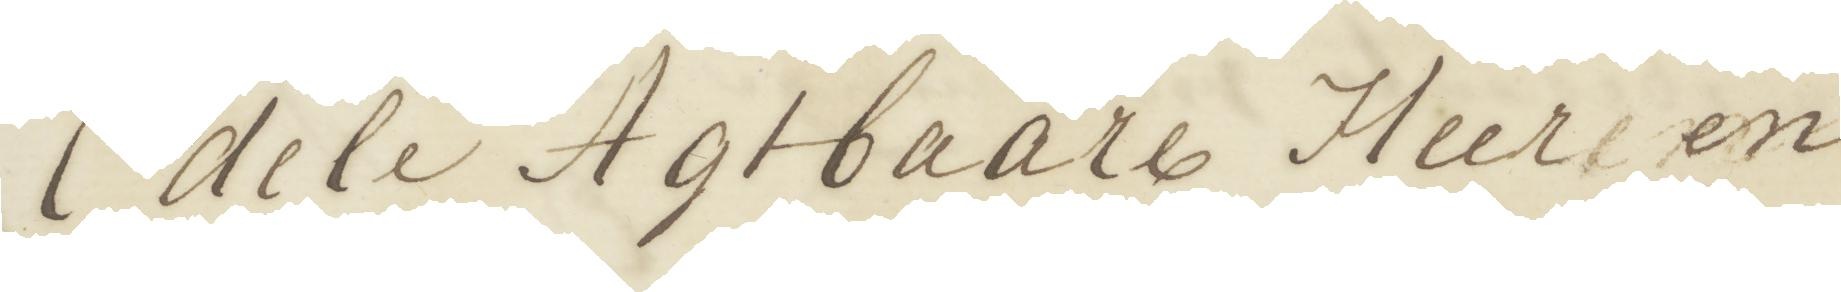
Edele Agtbaare Heer en
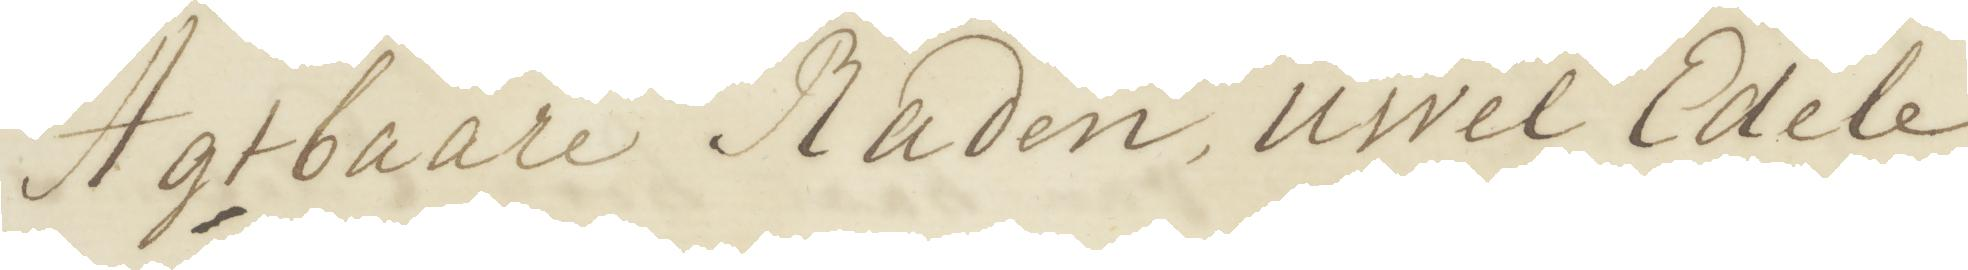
Agtbaare Raden, uwel Edele
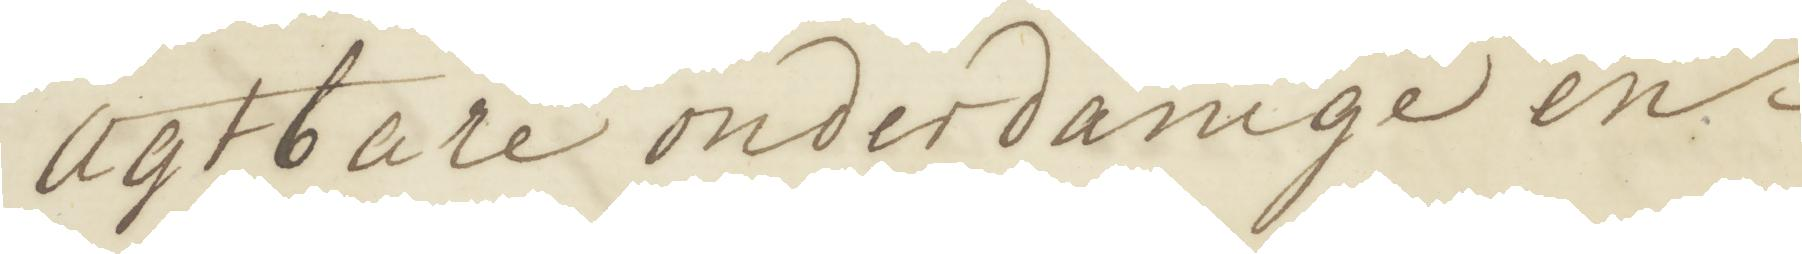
agtbare onderdanige en
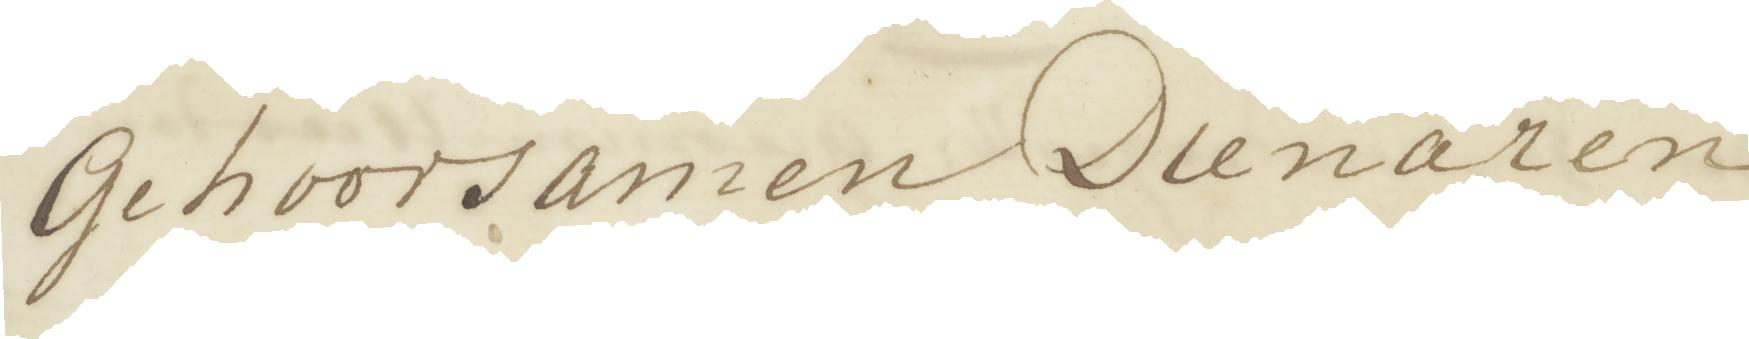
Gehoorsamen Dienaren
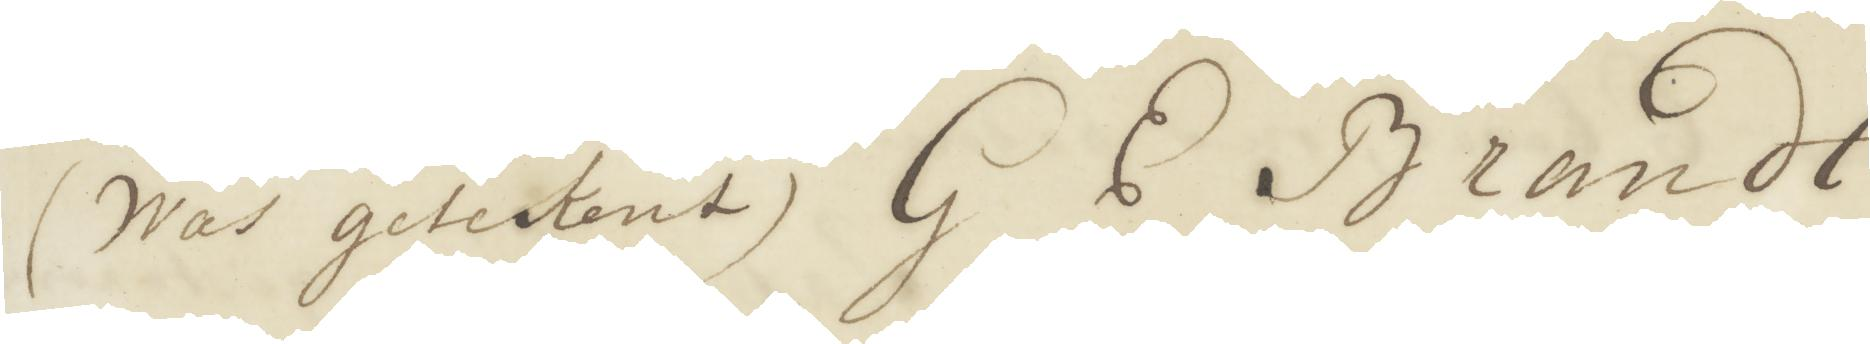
(was getekent) G E Brandt
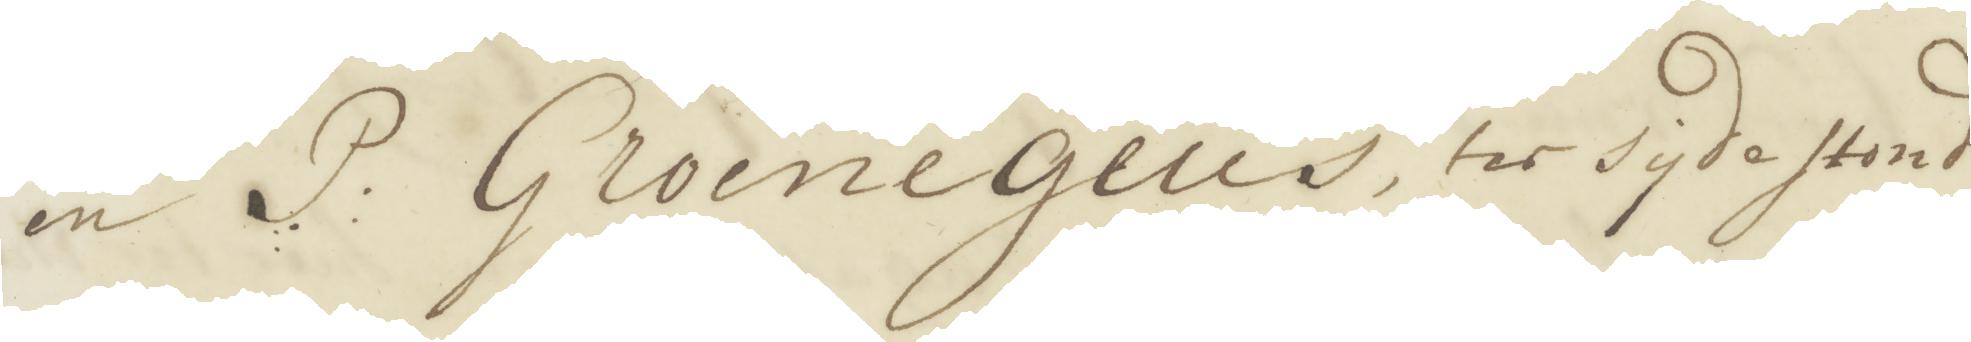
en P: Groenegeus, ter sijde stond
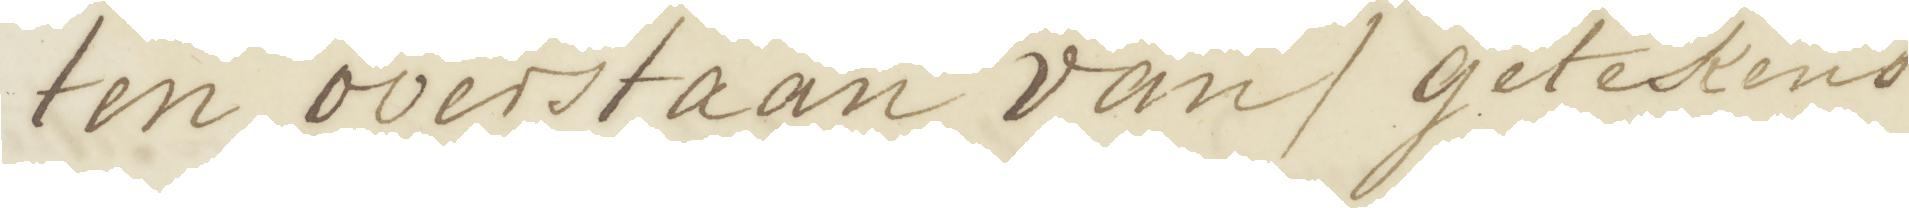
ten overstaan van /getekend
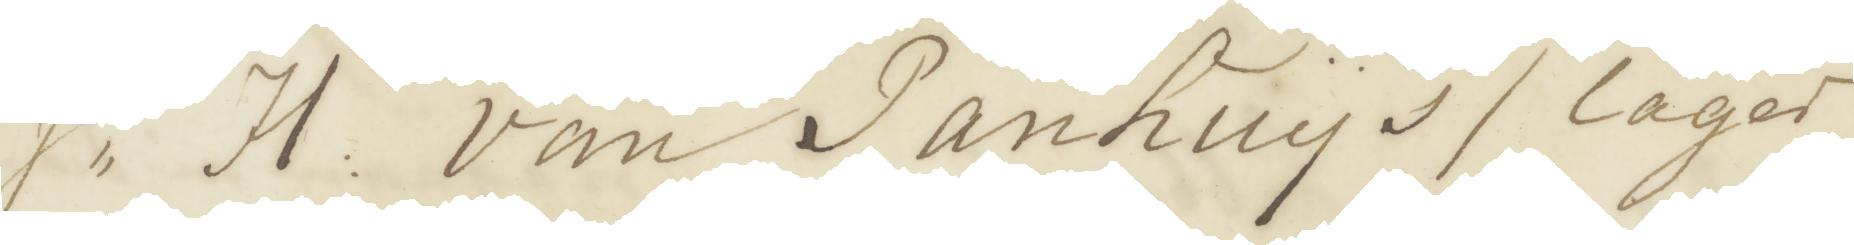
J„r H: van Panhuijs / lager
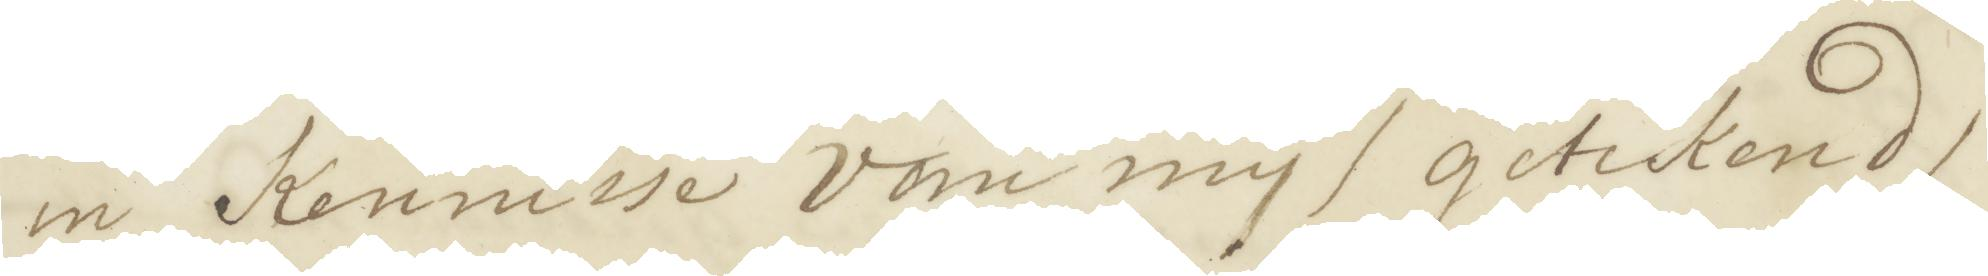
in Kennisse van mij /getekend/
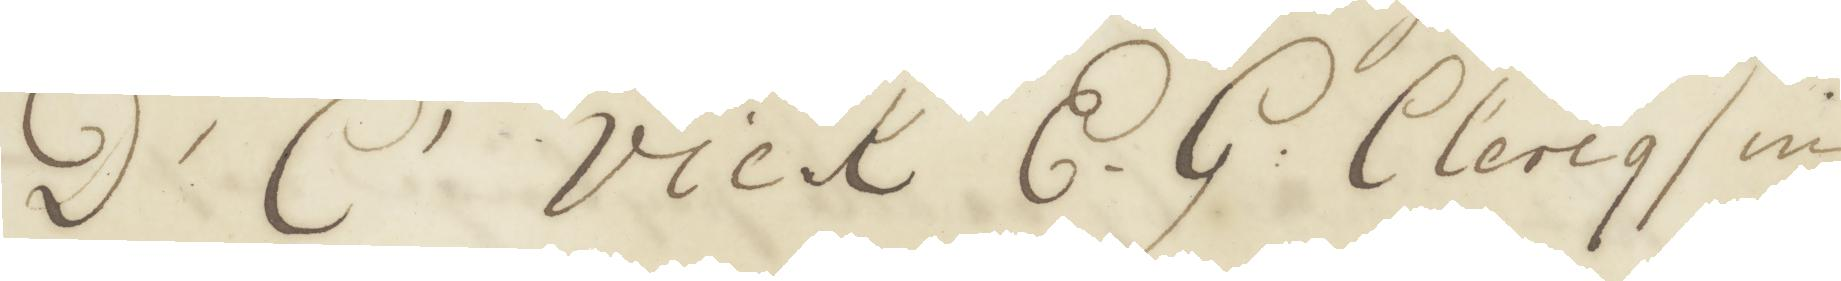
D' C' Vick E: G: Clercq / in
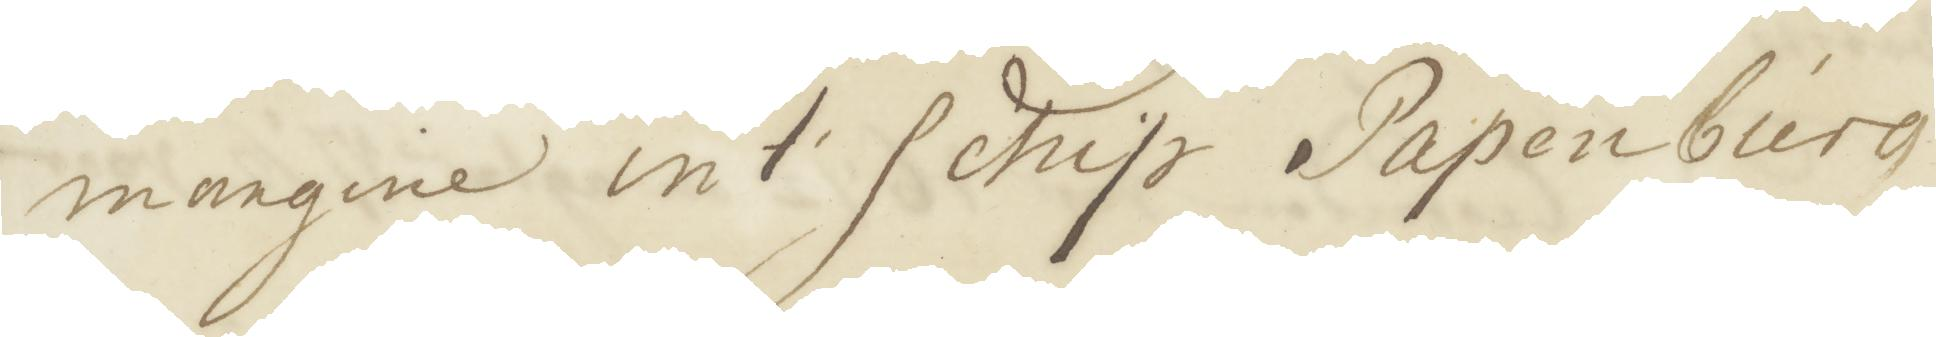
margine in t' schip Papenburg
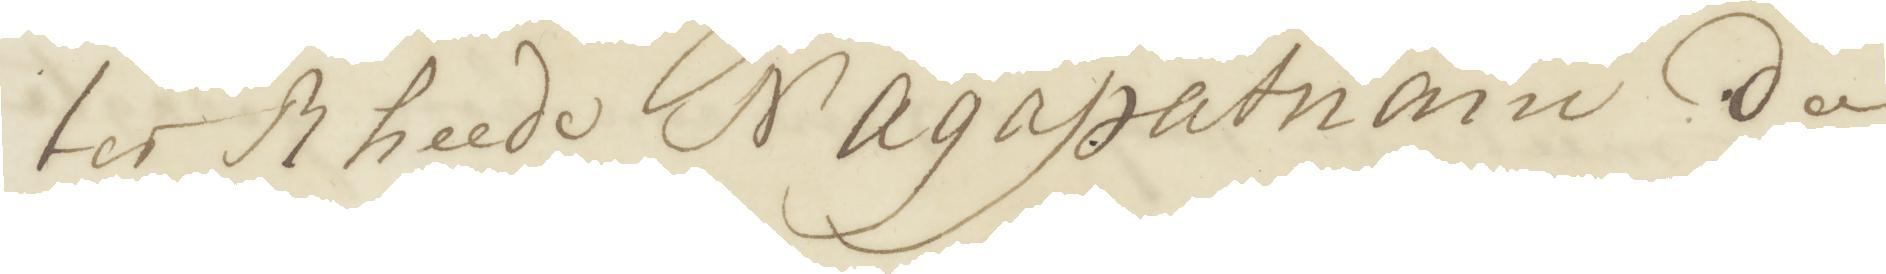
ter Rheede Nagapatnam den
